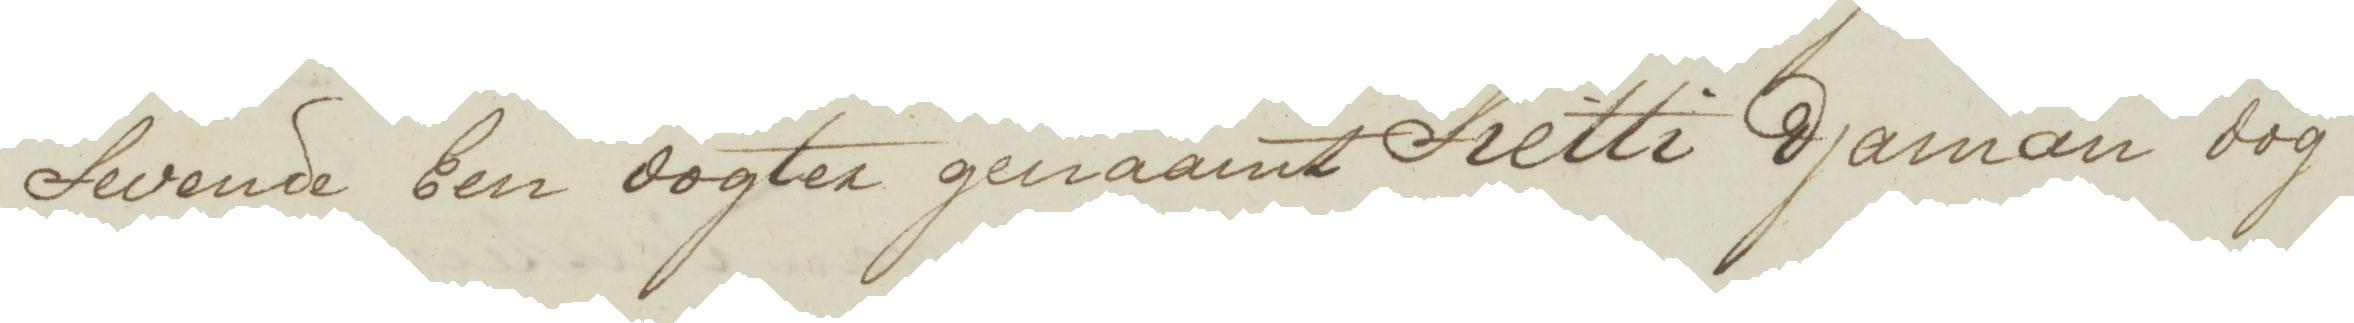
sevende Een dogter genaamt Sietti djaman dog
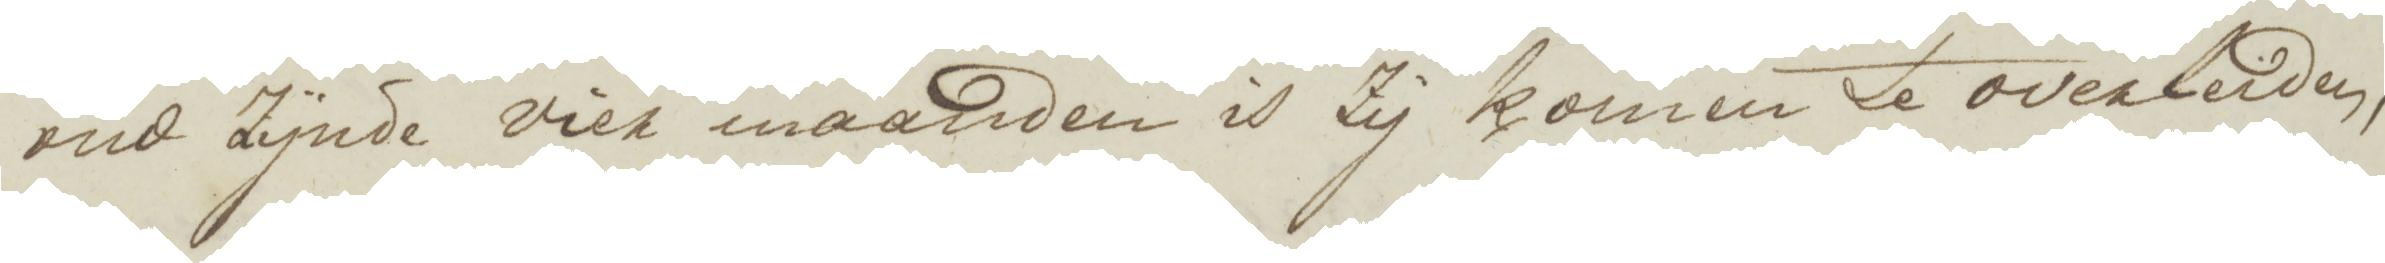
oud zijnde vier maanden is zij komen te overleiden,
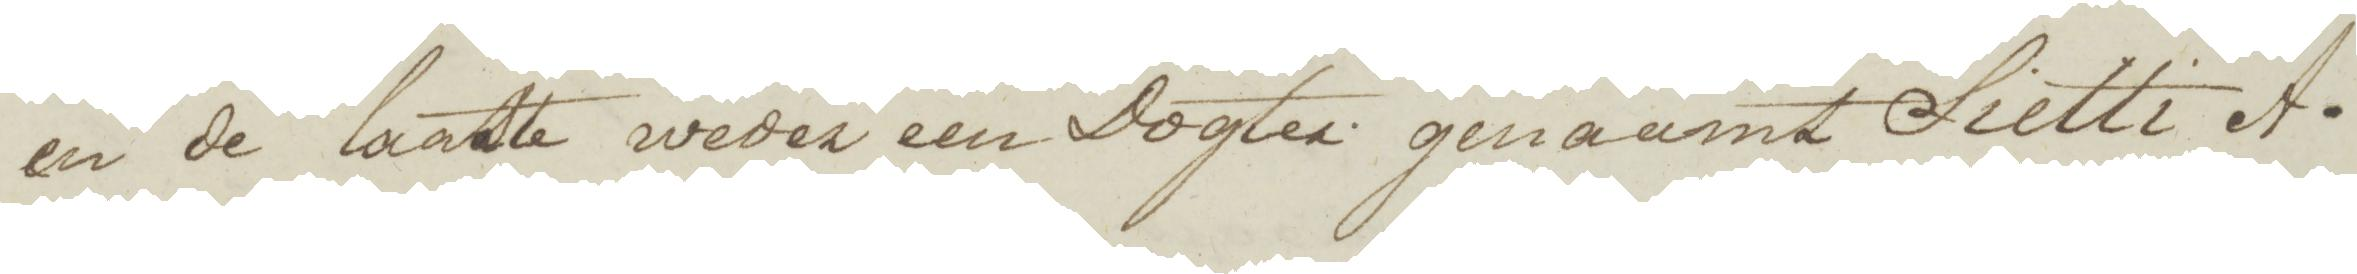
en de laaste weder een Dogter genaamt Sietti A-
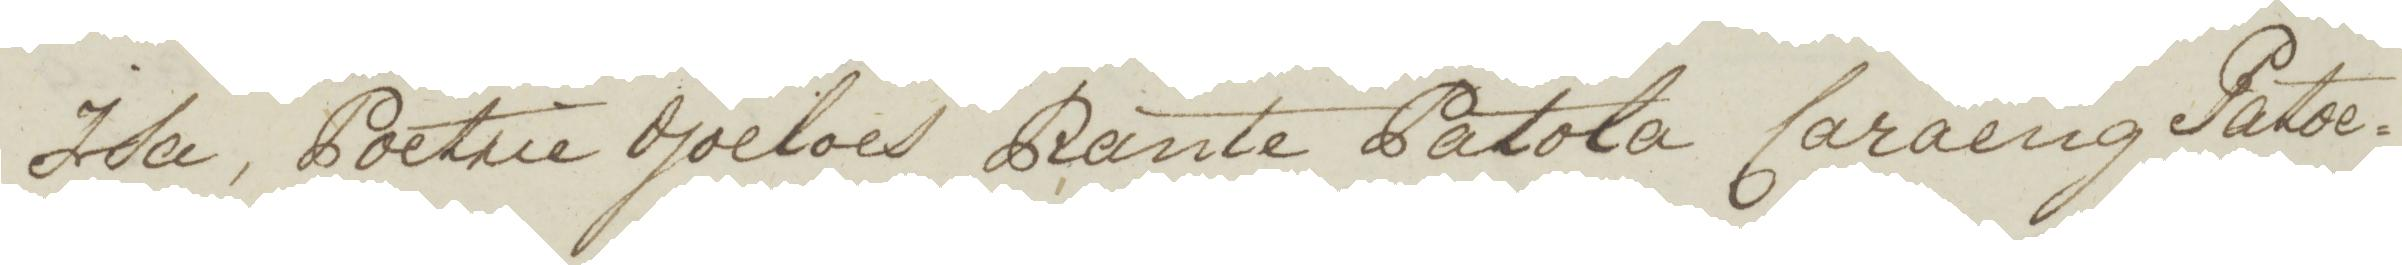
Irsa, Poetrie djoeloes Bante Patola Caraeng Patoe=
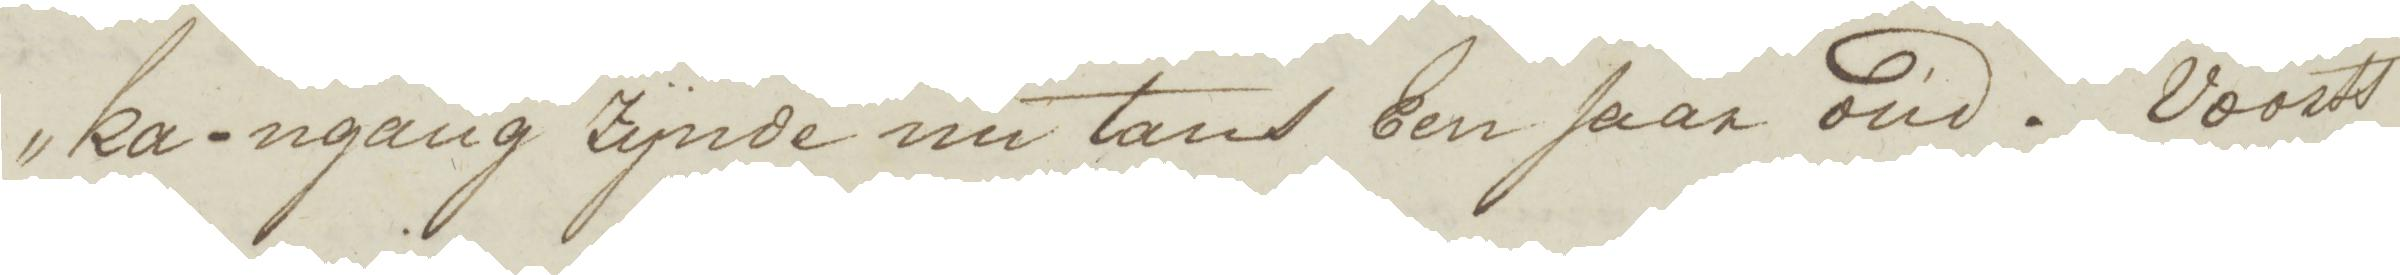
„ka-ngang zijnde nu tans Een jaar oud. voorts
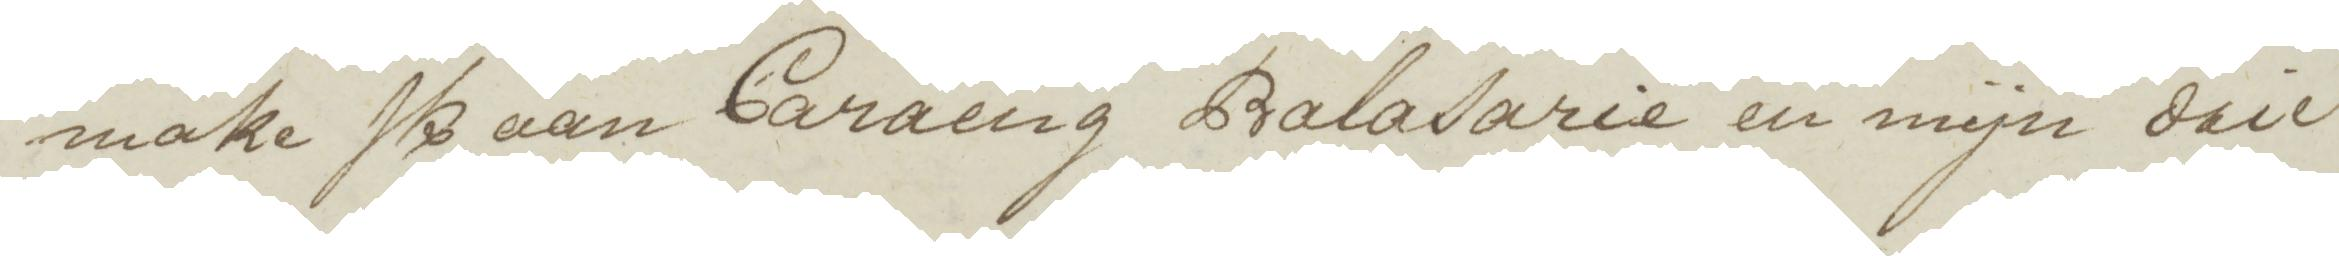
make jk aan Caraeng Balasarie en mijn drie
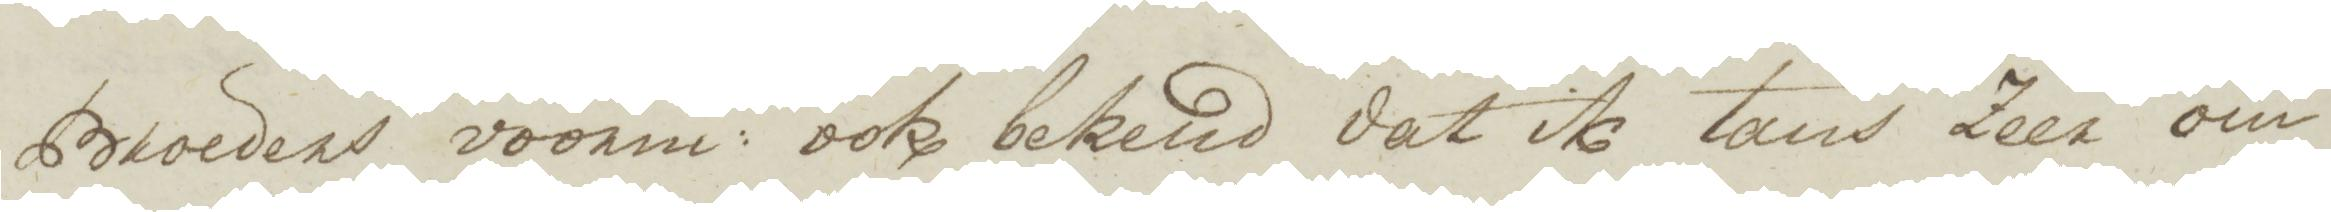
Broeders voorm: ook bekend dat ik tans zeer om
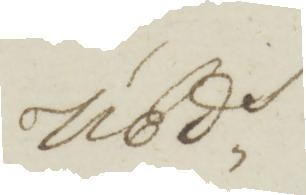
uEd„s
